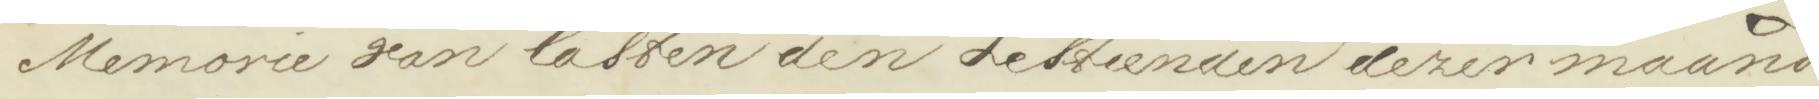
Memorie van lasten den Zestienden dezer maand
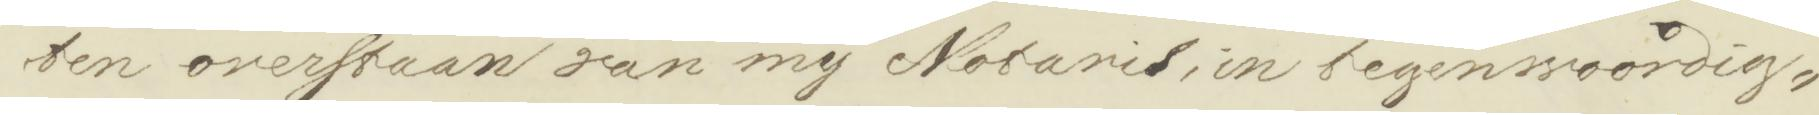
ten overstaan van mij Notaris, in tegenwoordig„
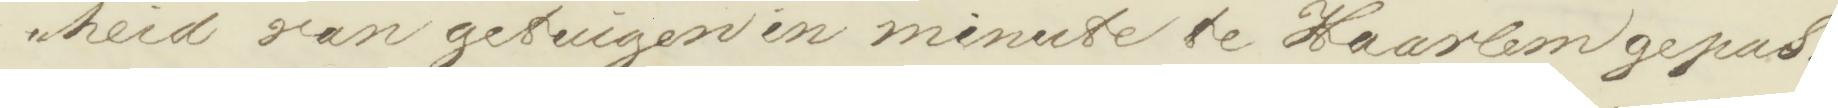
„heid van getuigen in minute te Haarlem gepas„
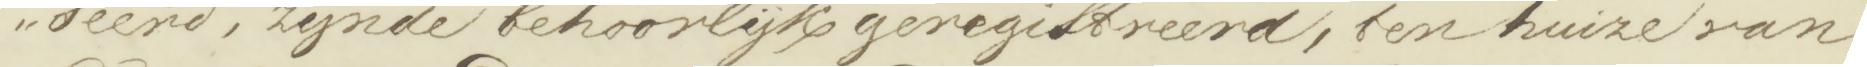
„seerd, zijnde behoorlijk geregistreerd, ten huize van
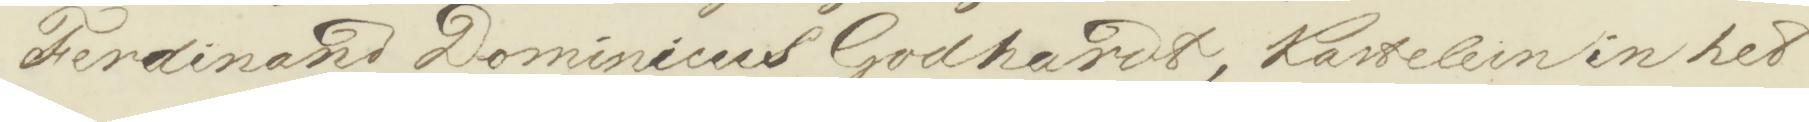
Ferdinand Dominicus Godhardt, Kastelein in het
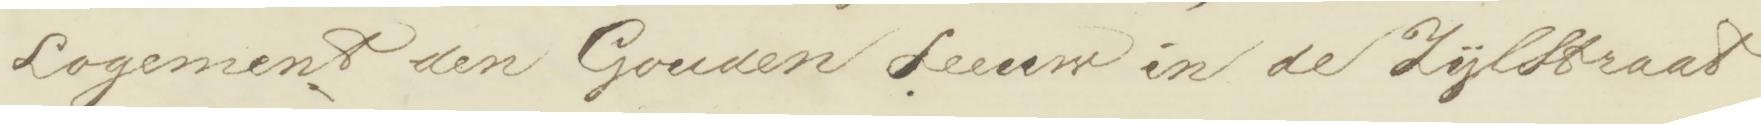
Logement den Gouden Leeuw in de Zijlstraat
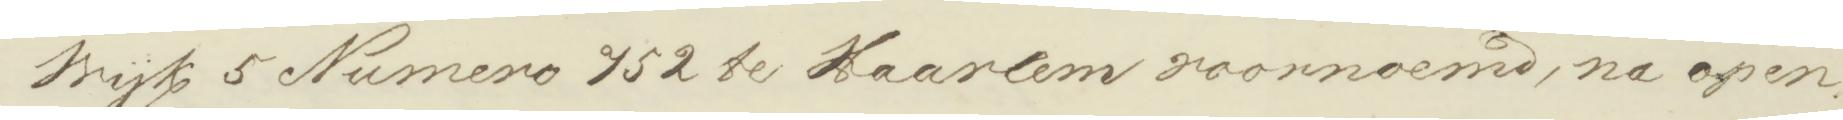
Wijk 5 Numero 752 te Haarlem voornoemd, na open
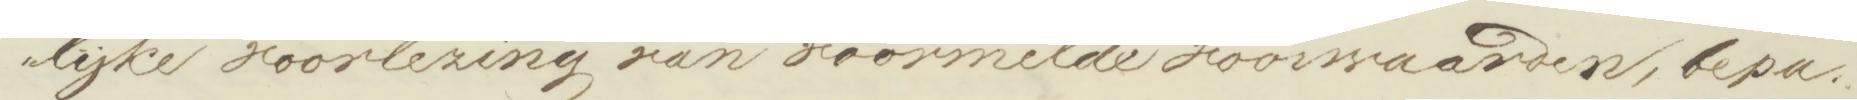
„lijke voorlezing van voormelde voorwaarden, bepa„
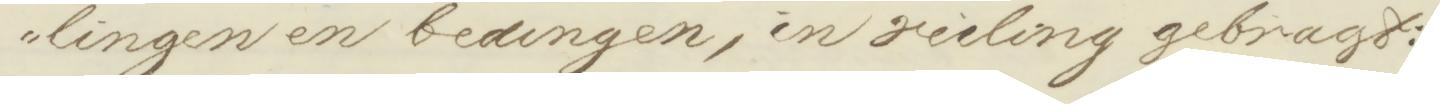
„lingen en bedingen, in veiling gebragt:
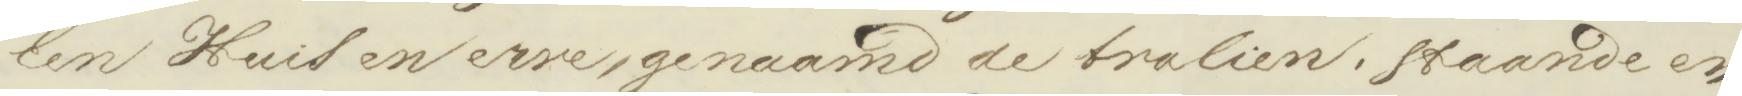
Een Huis en erve, genaamd de tralien, staande en
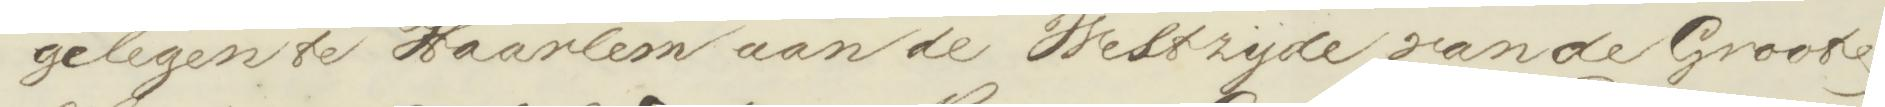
gelegen te Haarlem aan de Westzijde van de Groote
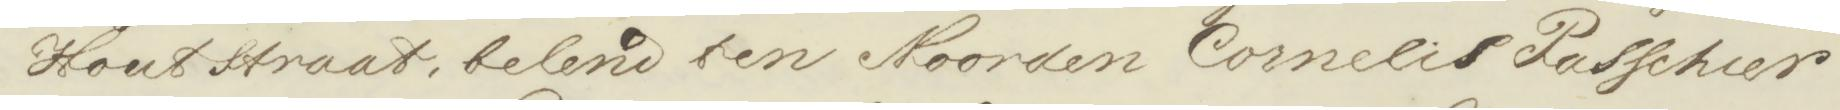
Houtstraat, belend ten Noorden Cornelis Passchier
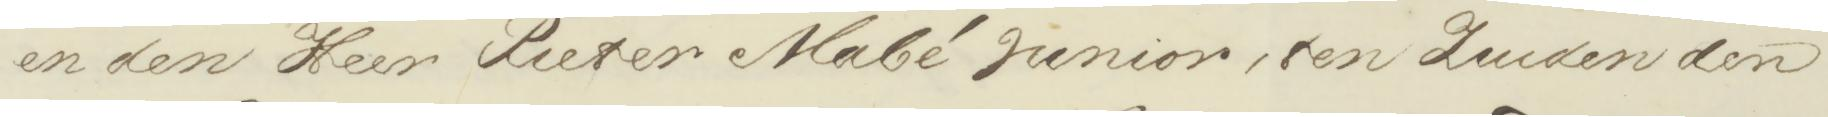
en den Heer Pieter Mabé Junior, ten Zuiden den
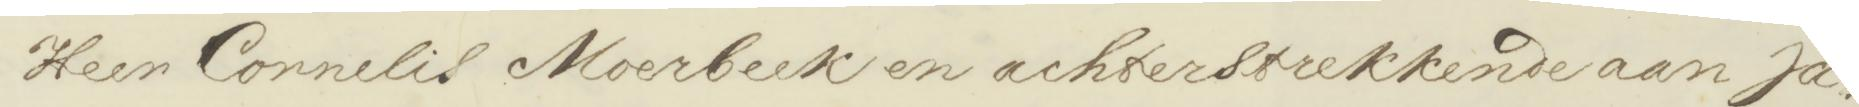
Heer Cornelis Moerbeek en achterstrekkende aan Ja„
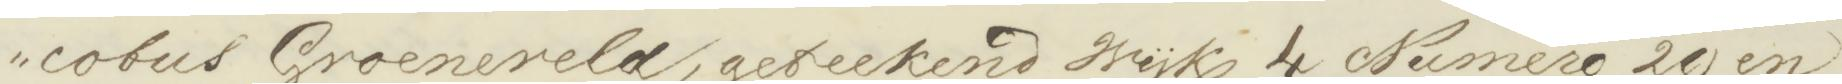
„cobus Groeneveld, geteekend Wijk 4 Numero 29 en
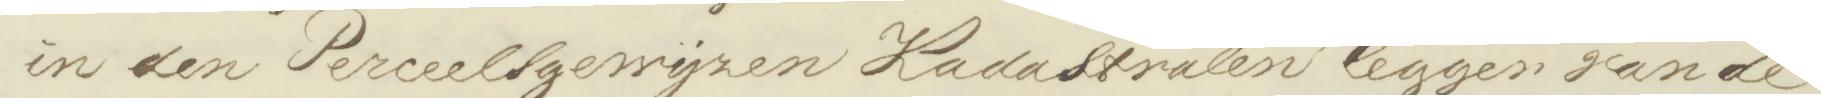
in den Perceelsgewijzen Kadastralen legger van de
